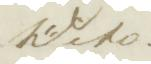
Dito . . . . . . . . . .
